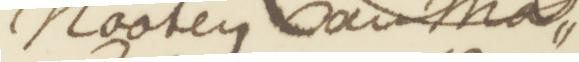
Nooten van ma„
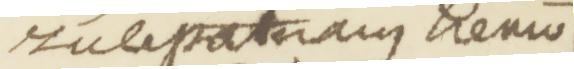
zulipatnam herw„ts
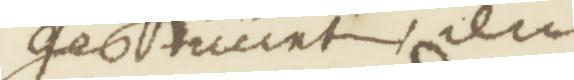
gestuurt, en
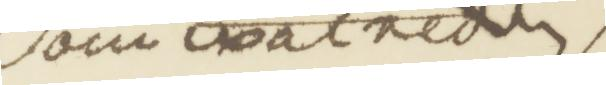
om wat reden,
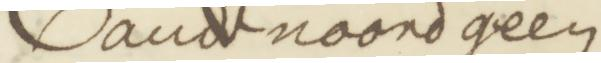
van de noord geen
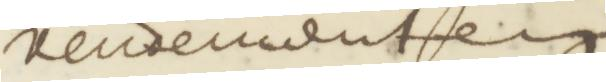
rendementen
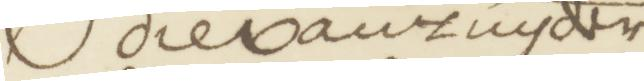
die van zuyden
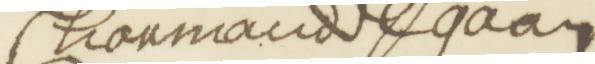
Chormandel gaan
